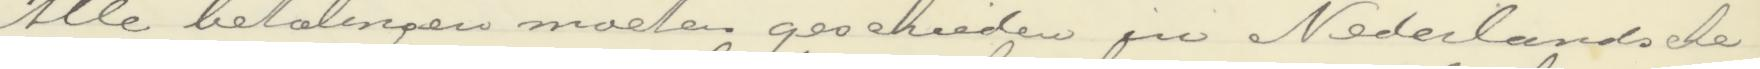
Alle betaingen moeten geschieden in Nederlandsche
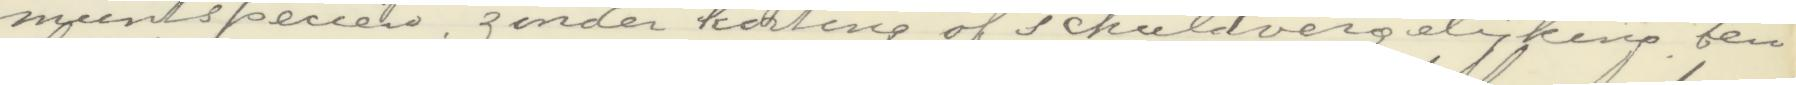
muntspecien, zonder korting of schuldvergelijking ten
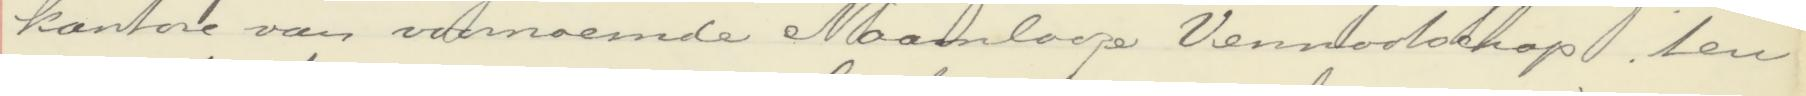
kantore van voernoemde Naamlooze Vennootschap, ten
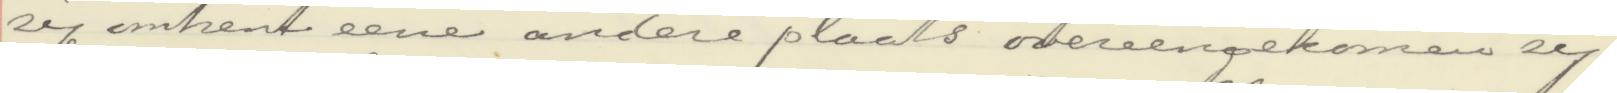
zij omtrent eene andere plaats overeengekomen zij
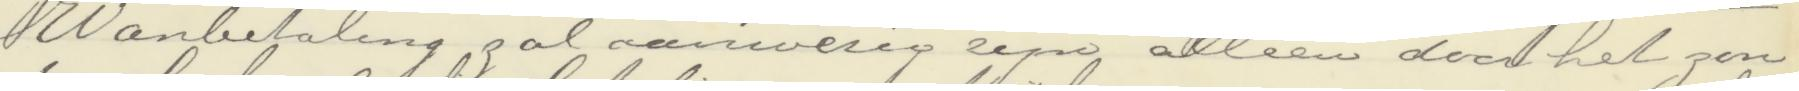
Wanbetaling zal aanwezig zijn, alleen door het zon
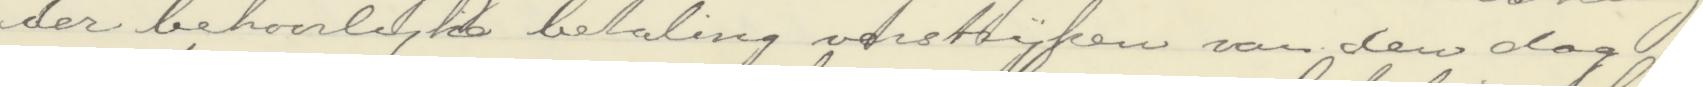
der behoorlyke betaling verstrijken van den dag o
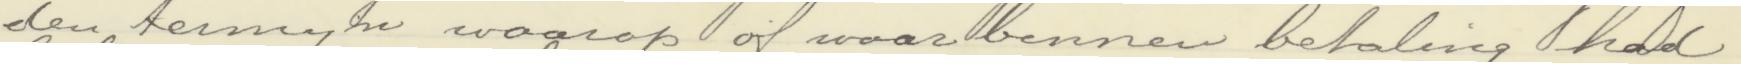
den termyn waarop of waar binnen betaling had
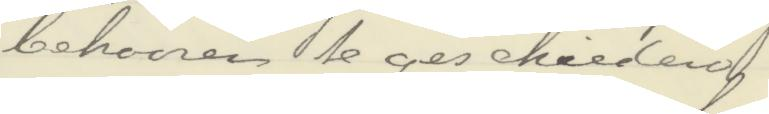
behooren te geschieden
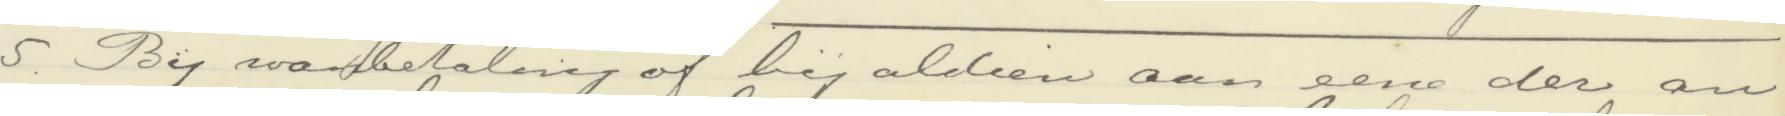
5. Bij wanbetaling of bij aldien aan eene der an
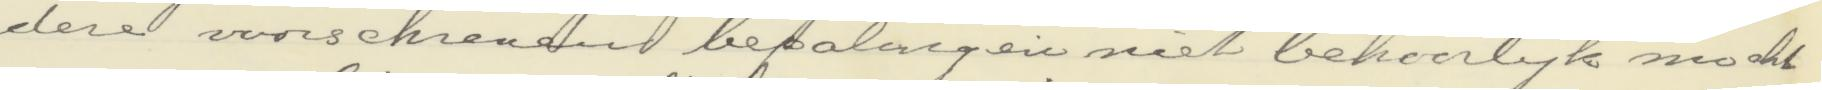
dere voorschreven bepalingen niet behoorlyk mocht
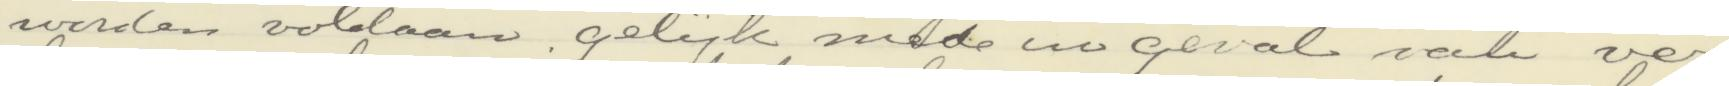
worden voldaan, gelijk mede in geval van ver
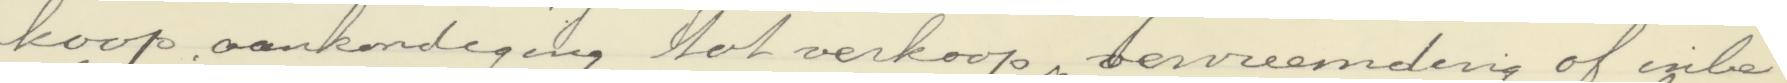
koop, aankondiging tot verkoop, vervreemding of inbe
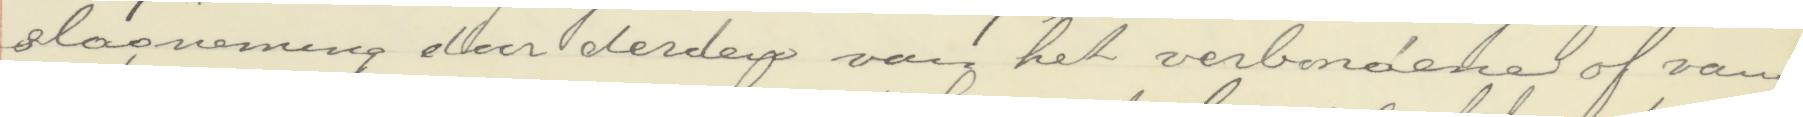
slagneming door derden van het verbondene of van
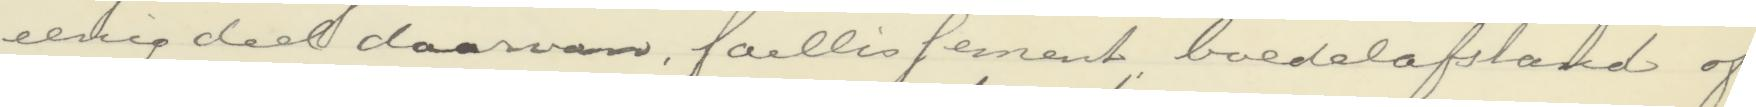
eenig deel daarvan, faillissement, boedelafstand of
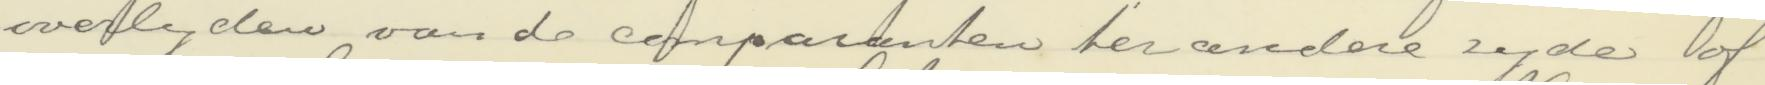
overlyden van de comparanten ter andere zyde of
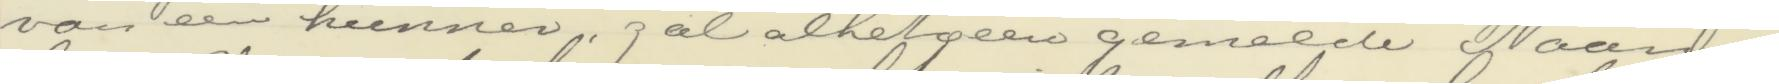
van een hunner, zal alhet geen gemelde Naam
